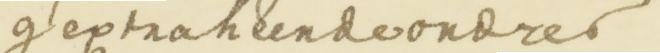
g' extra heerde ordres
